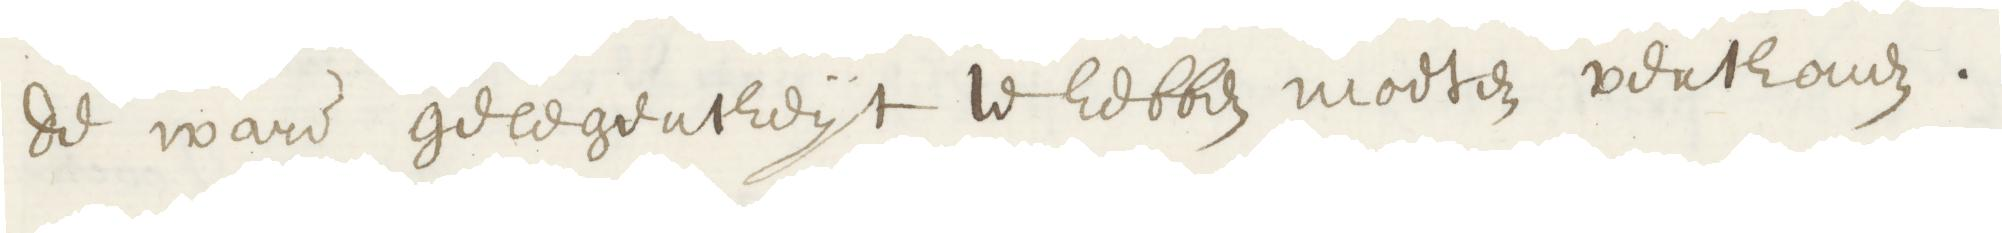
de ware gelegentheijt te hebben moeten verthonen.
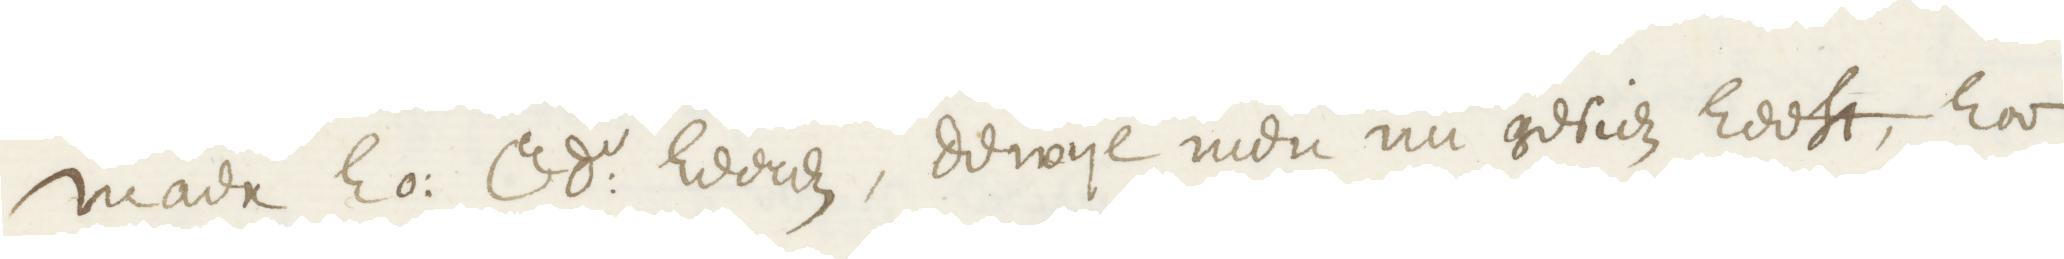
maer ho: Ed:e heeren, de wijl men nu gesien heeft, hoe
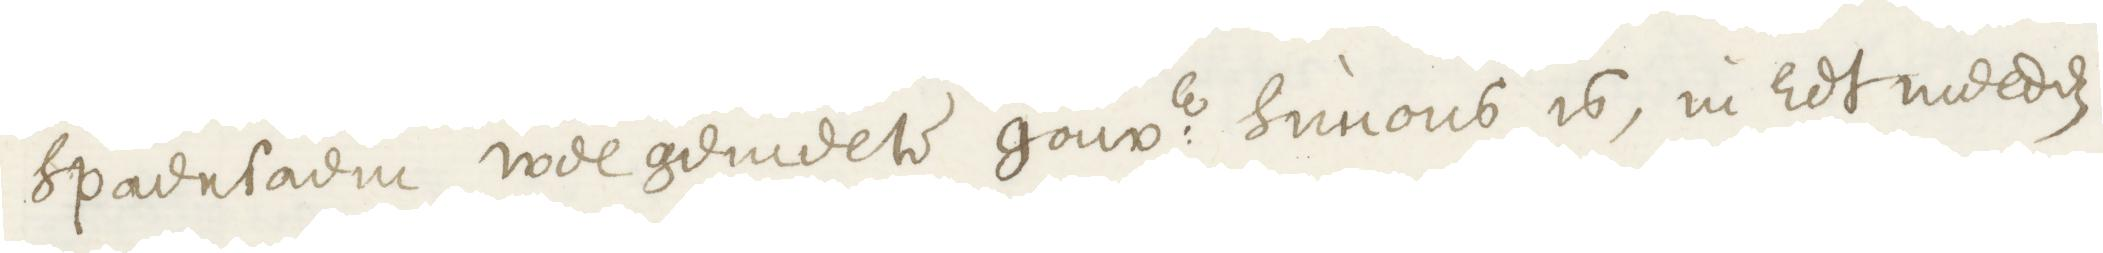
spaersaem wel gemelte gouv:r simons is, in het melden
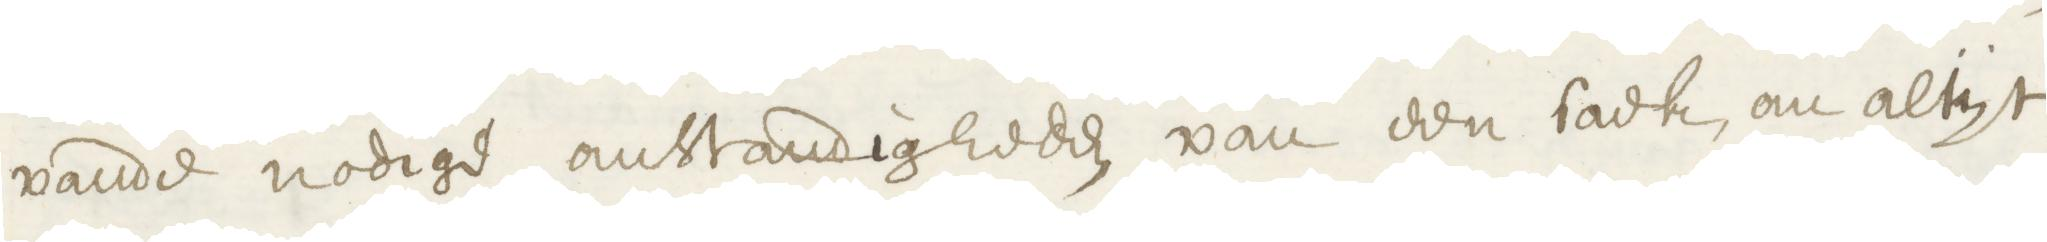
vande nodige omstandigheden van een saek, om altijt
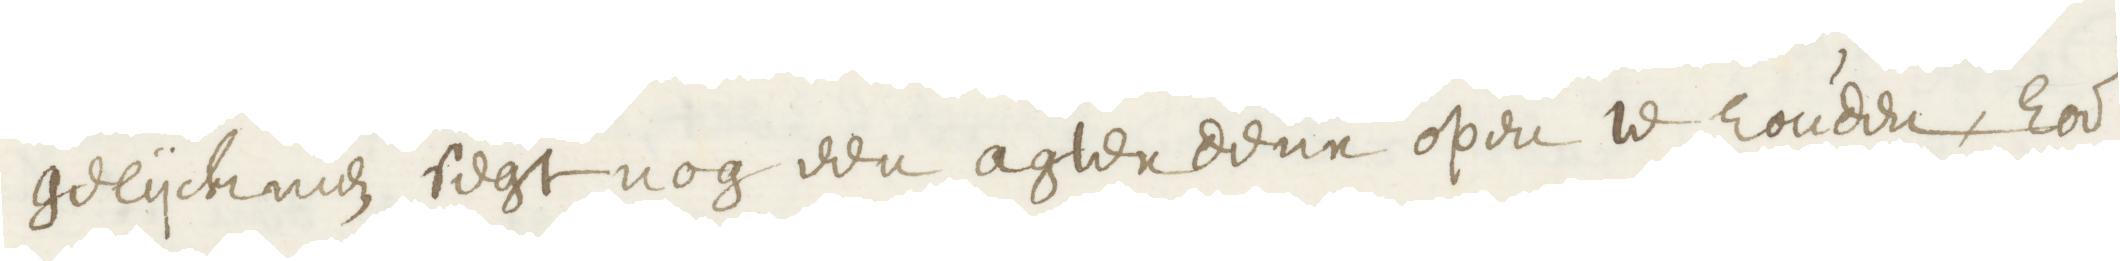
gelijck men segt nog een agterdeur open te houden, hoe
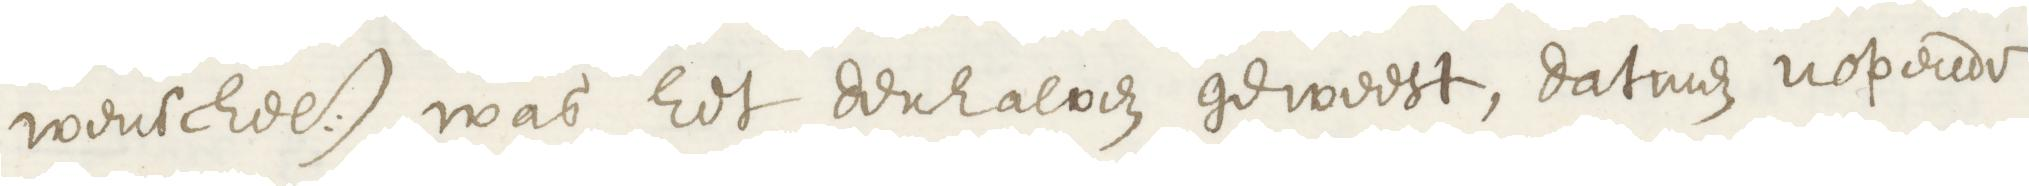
wenschelijk was het derhalven geweest, dat men nopende
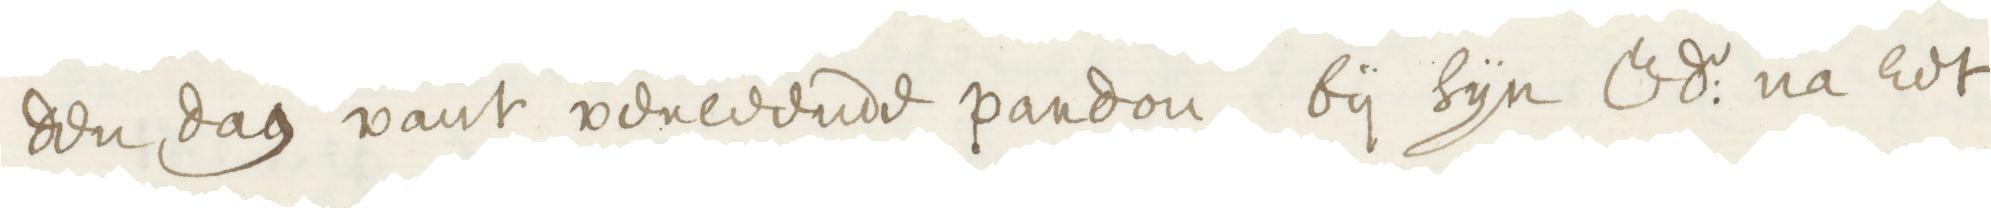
den dag van’t verleende pardon, bij sijn Ed: na het
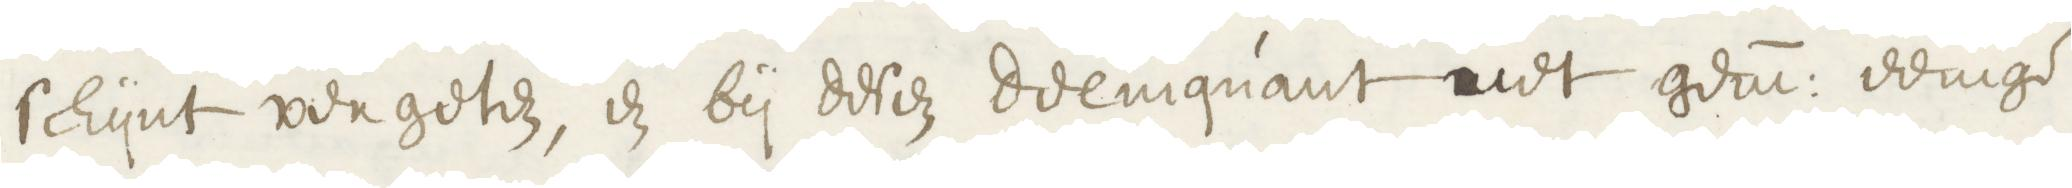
schijnt vergeten, en bij desen delinquant niet gem: eenige
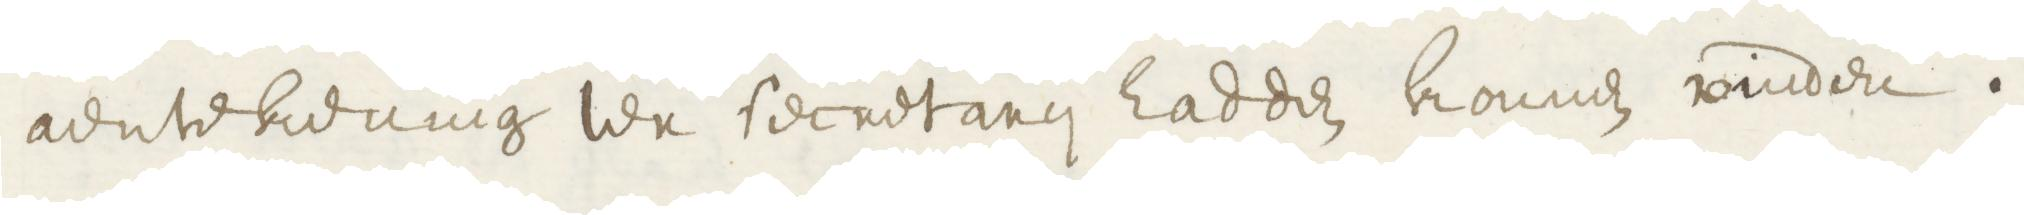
aentekening ter secretarij hadden konnen vinden.
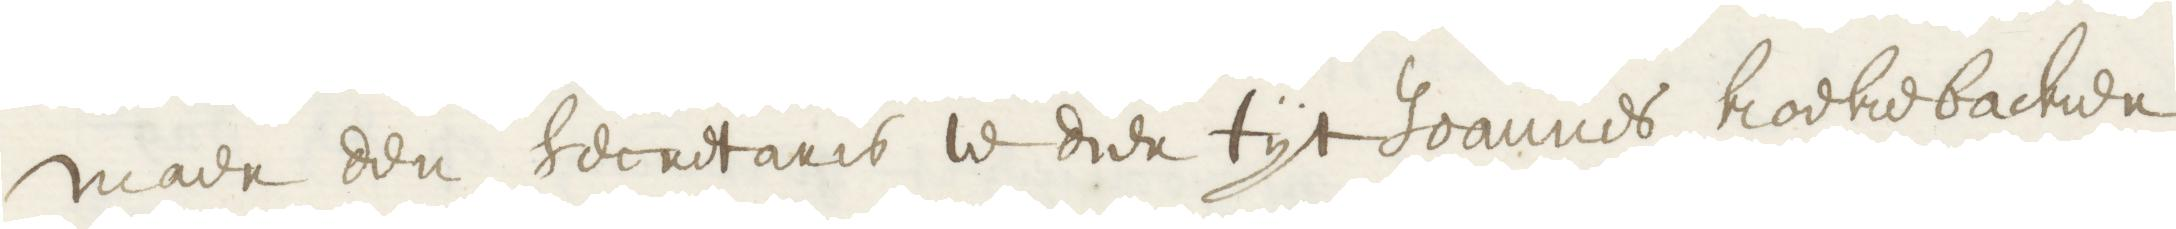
maer den secretaris te dier tijt Joannes koekebacker
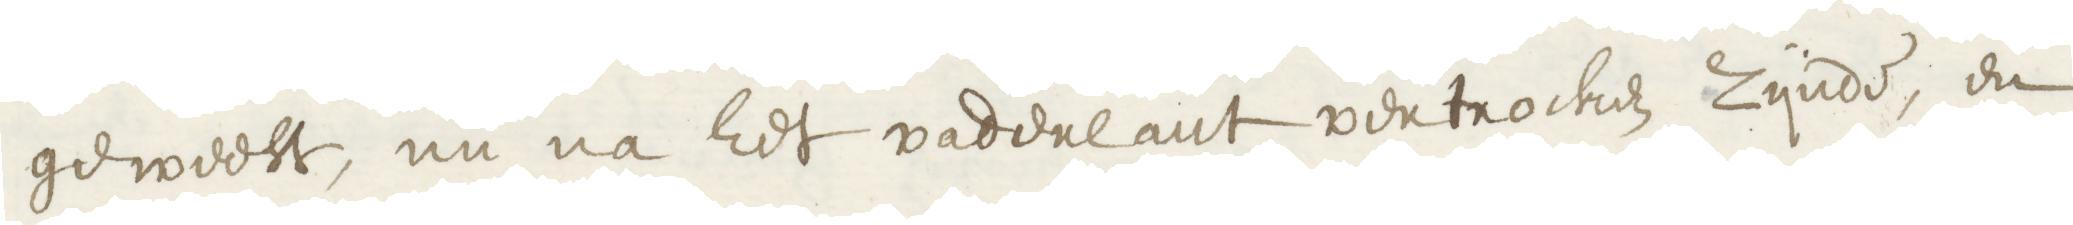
geweest, nu na het vaderlant vertrocken zijnde; en
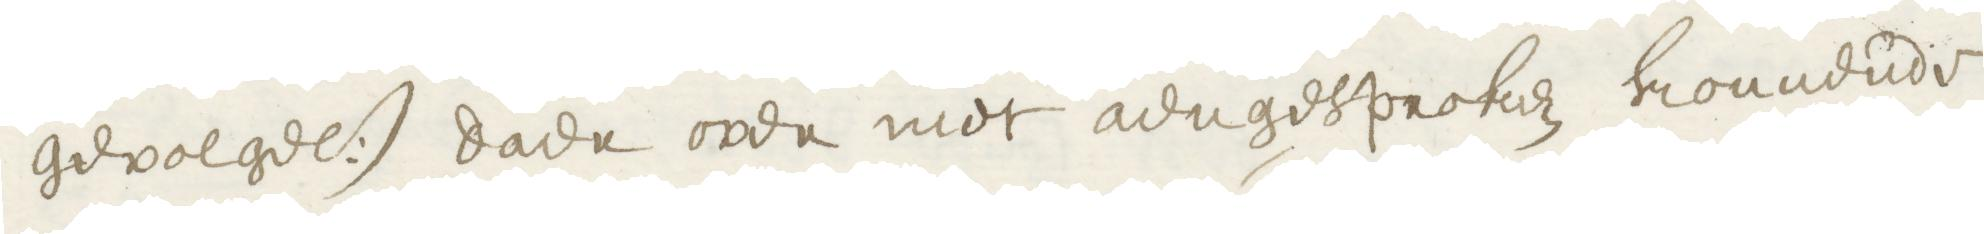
gevolgelijk daer over niet aengesproken konnende
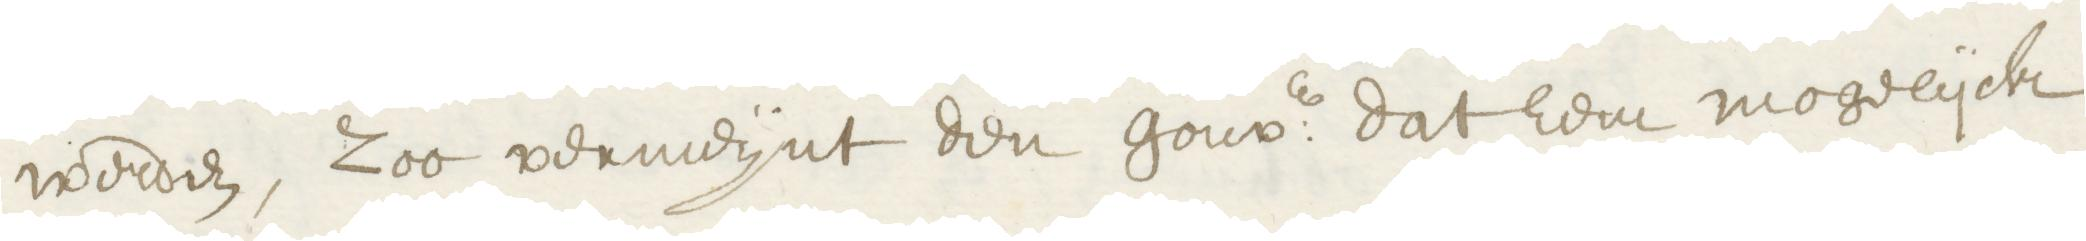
werden, zoo vermeijnt den gouv:r dat hem mogelijck
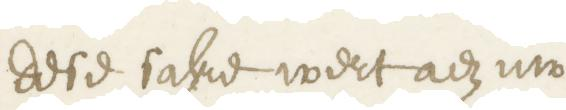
dese sake wert aen uw
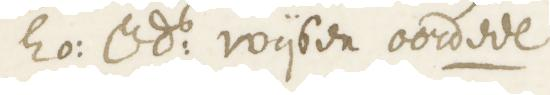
ho: Ed:s wijser oordeel
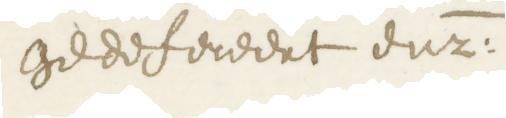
gedefereert enz:
